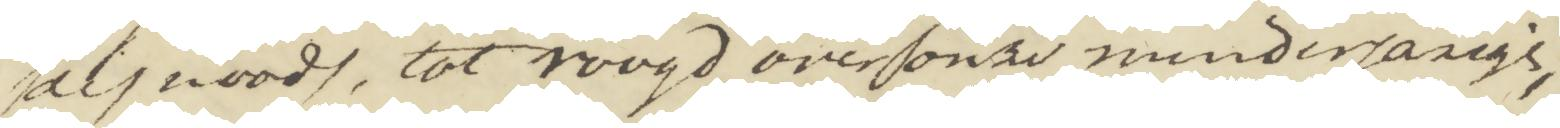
des noods, tot voogd over onze minderjarigen,
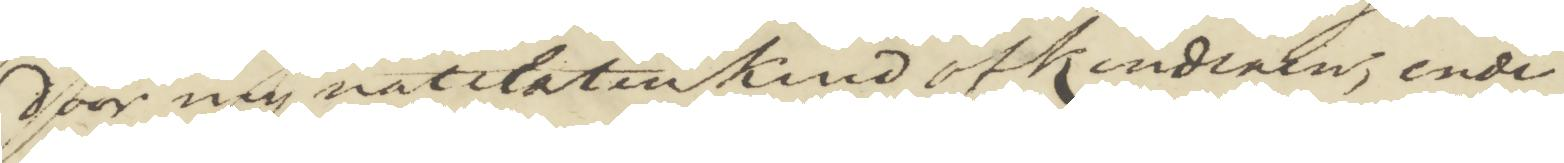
door my natelaten kind of kinderen, ende
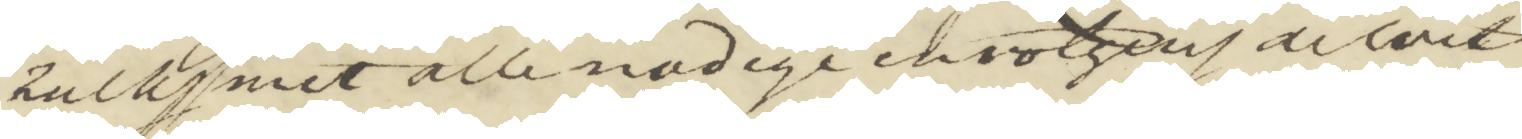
zulks met alle nodige en volgens de wet
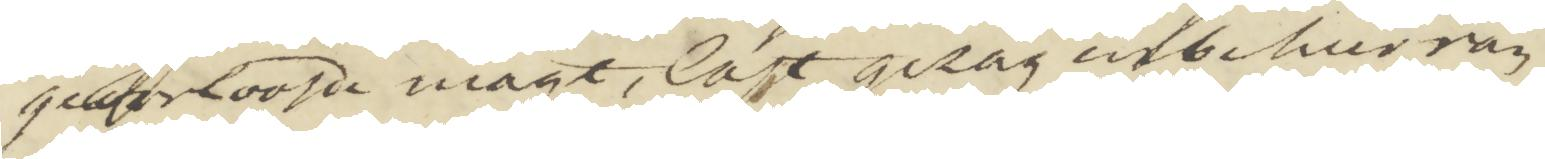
geoorloofde magt, last gezag en beheer van
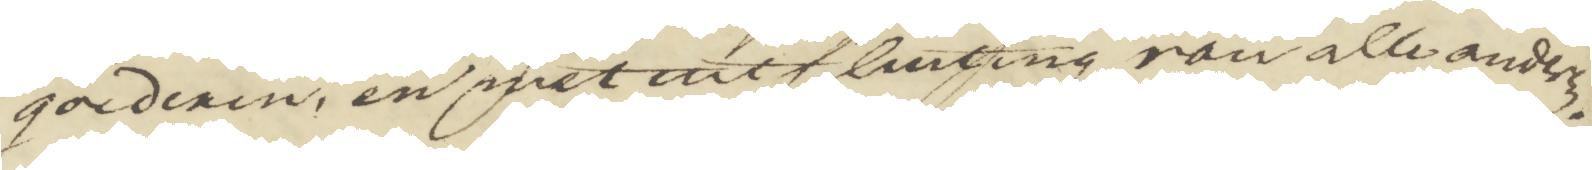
goederen, en met ontsluiting van alle anderen.
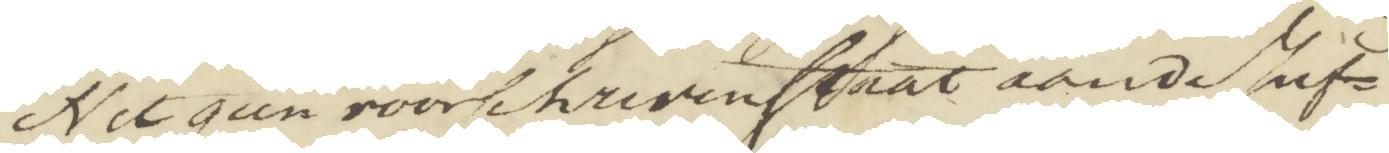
Het geen voorschreven staat aan de Juf=
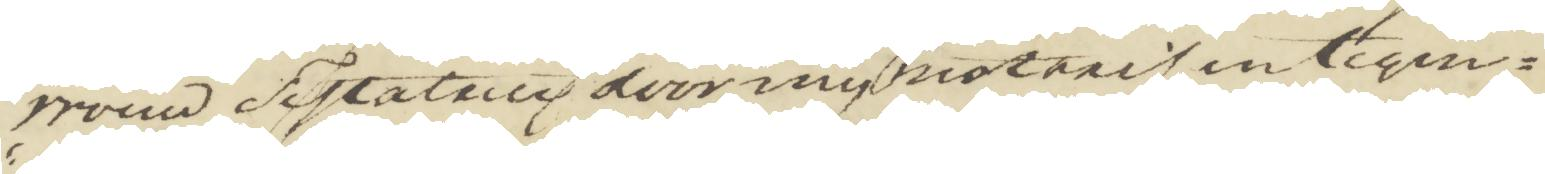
„vrouw Testateur door my notaris in tegen=
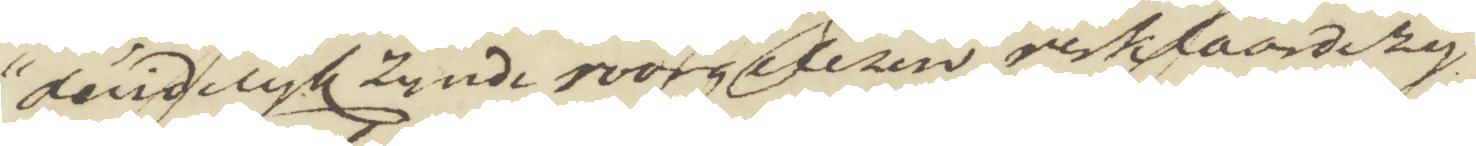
duidelyk zynde voorgelezen, verklaarde zy
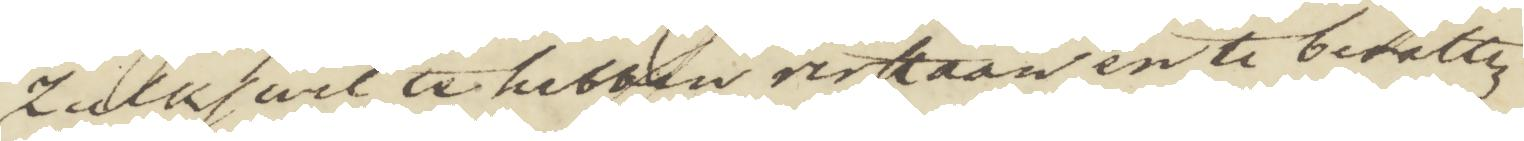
zulks wel te hebben verstaan en te bevatten
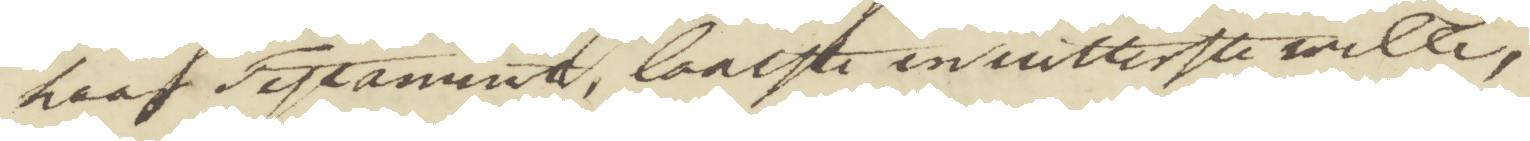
haar Testament, laatste en uitterste wille,
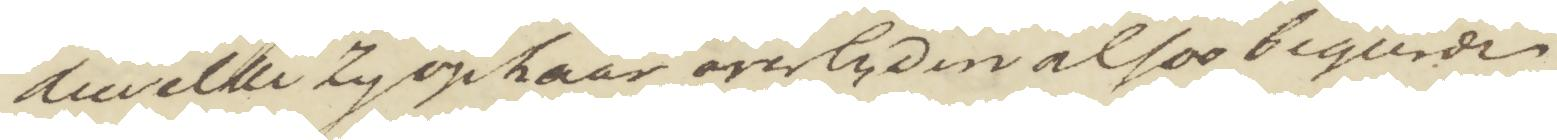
dewelke zy op haar overlyden alsoo begeerde
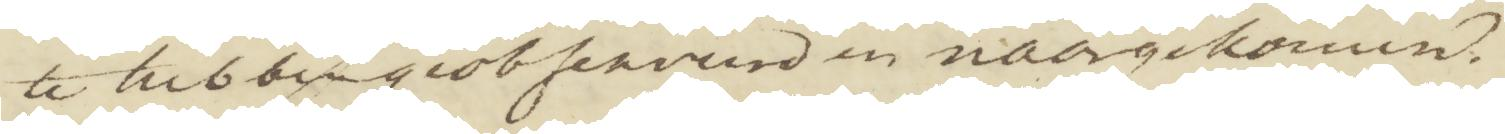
te hebben geobserveerd en naargekomen.
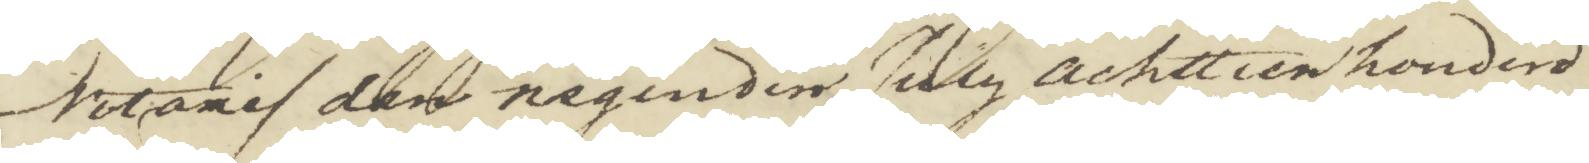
Notaris den negenden July achttien honderd
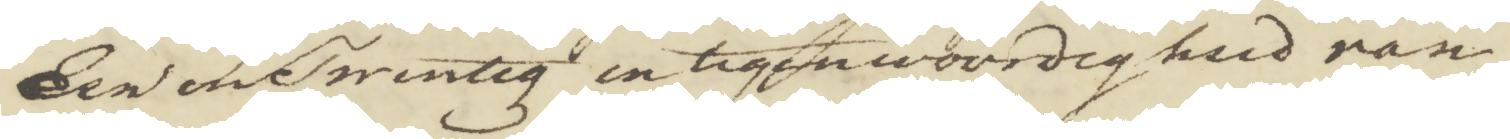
Een en Twintig in tegenwoordigheid van
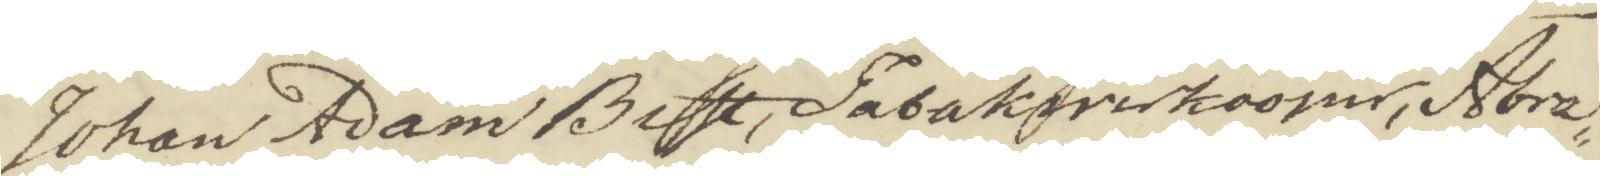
Johan Adam Best, Tabaksverkooper, Abra„
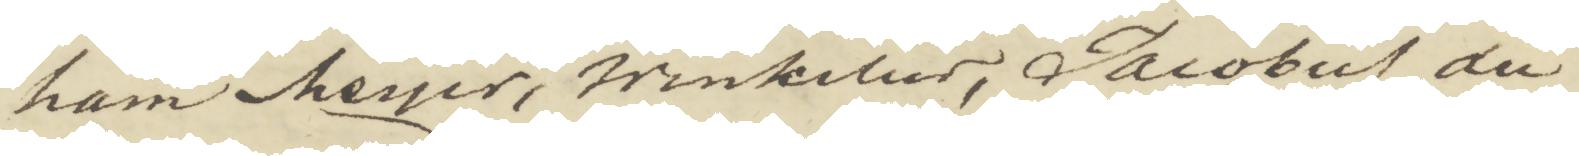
ham Meyer, winkelier, Jacobus du
